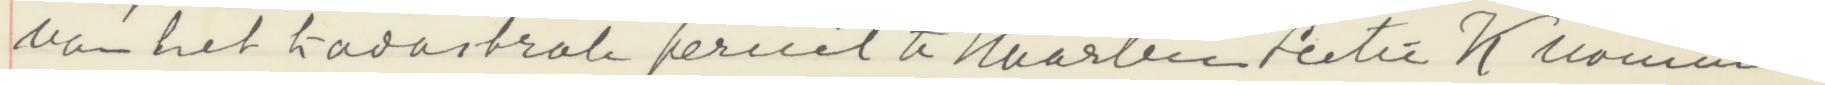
van het kadastrale perceel te Haarlem Sectie K nommer
